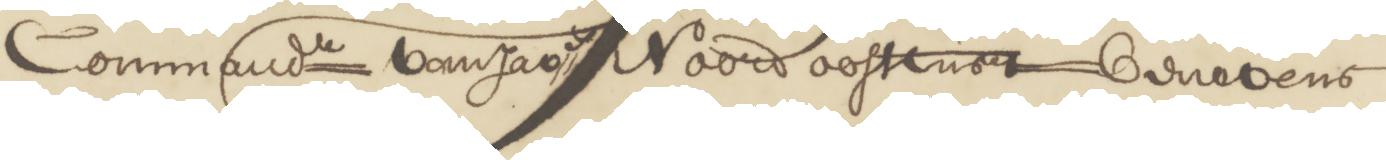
Command=r van Jav„s Noord oostcust benevens
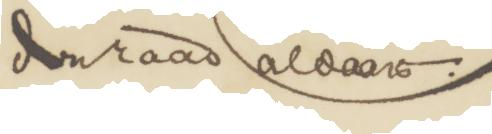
den raad aldaar.
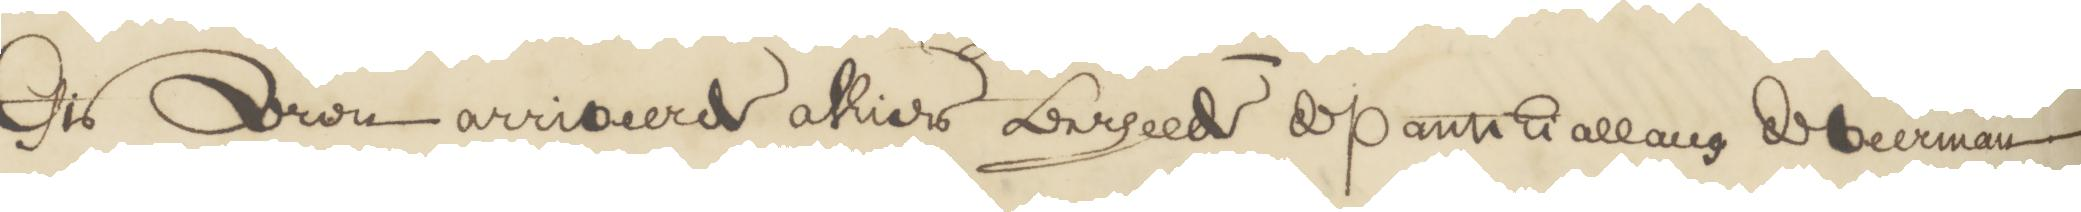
Gisteren arriveerde alhier terrheede de pantchiallang de veerman
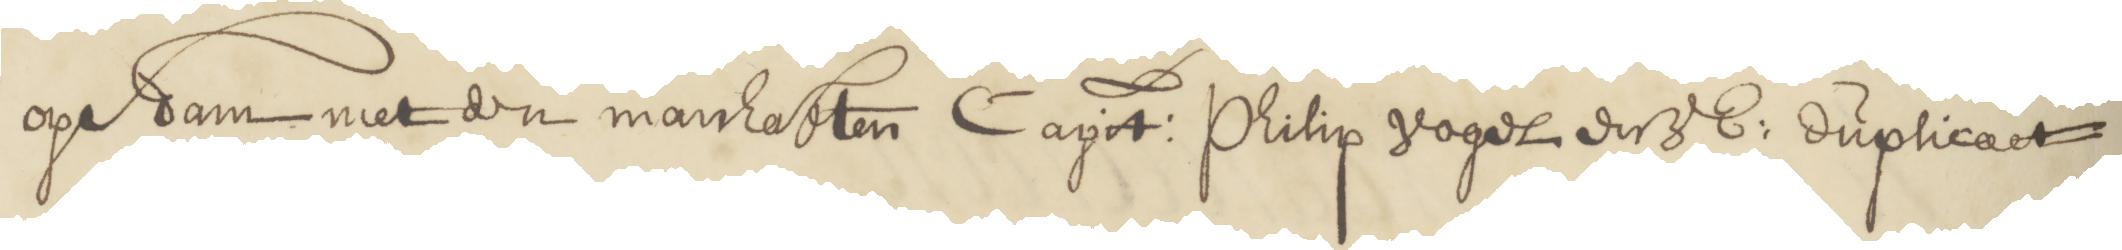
op Edam met den manhaften Capit: Philip Vogel en VE: duplicaet
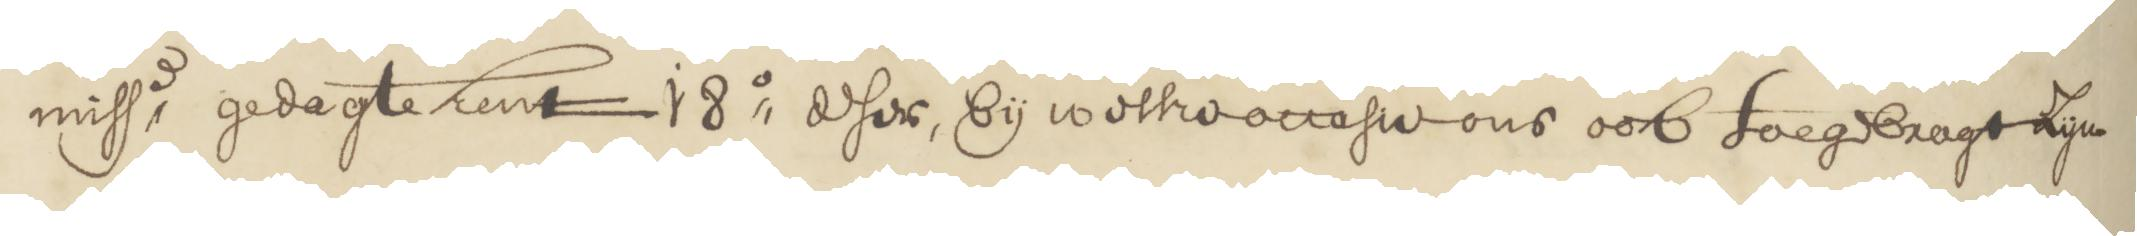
miss„e gedagtekent 18„o deser, bij welke occasie ons ook toegebragt zijn
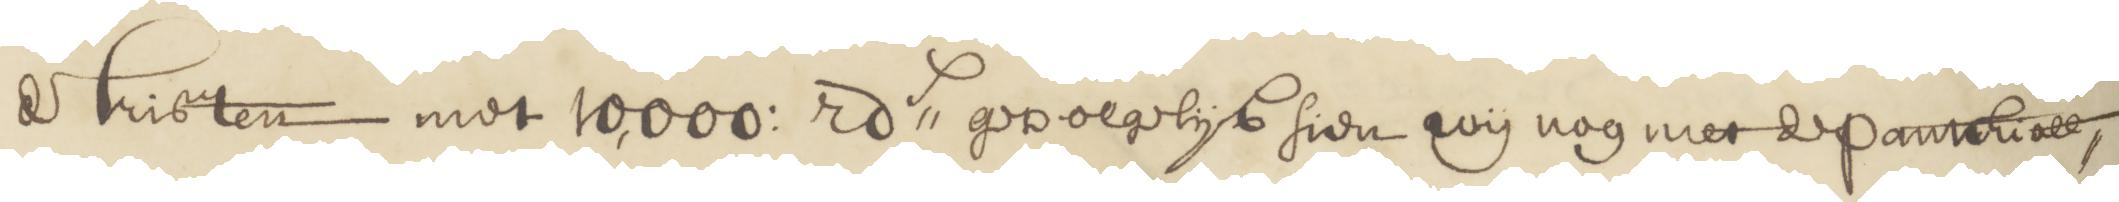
de kisten met 10,000: rd„s gevolgelijk sien wij nog met de pantchiall„
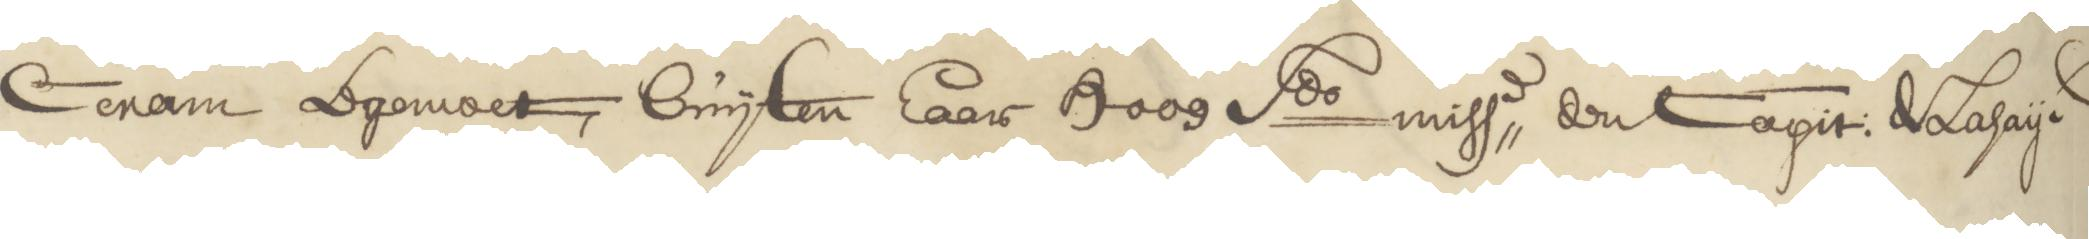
ceram tegemoet, buijten haar Hoog Ed=o miss„e den Capit: deLahaije
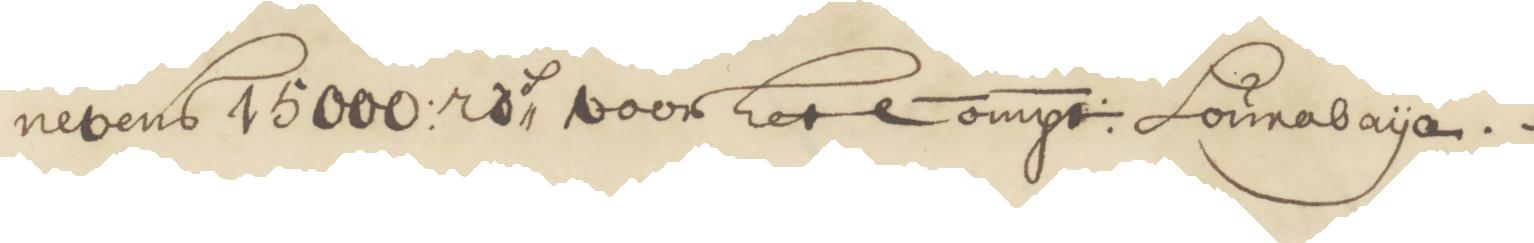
nevens 15000: rd„s voor het Compt: Sourabaija. —
